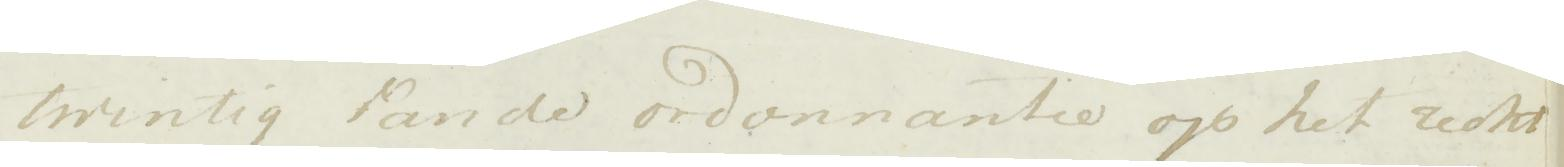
twintig van de ordonnantie op het recht
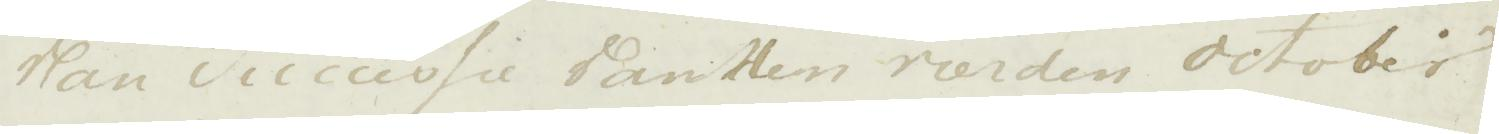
van Successie van den vierden october
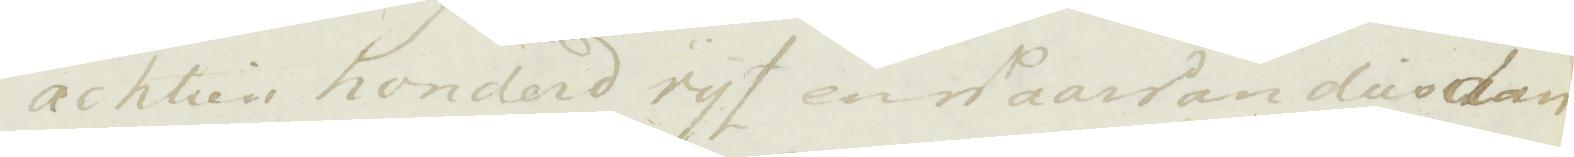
achtien honderd vijf en waarvan dus dan
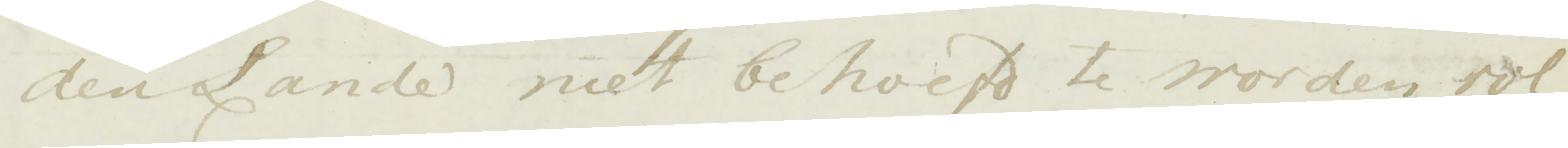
den Lande niet behoefd te worden vol,
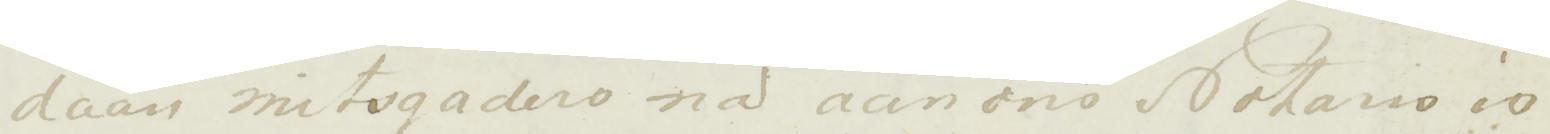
daan mitsgaders na aan ons Notaris is
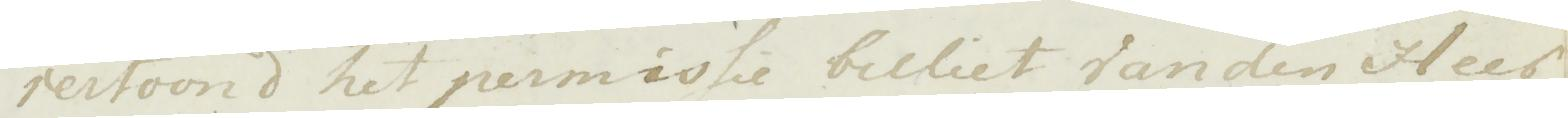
vertoond het permissie billiet van den Heer
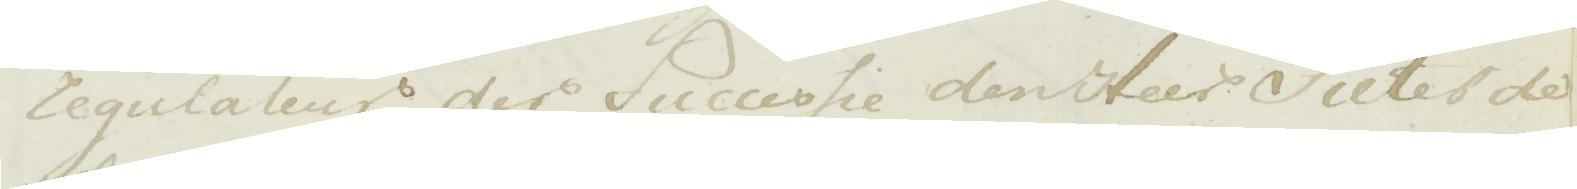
regulateur der Successie den Heer Pieter de
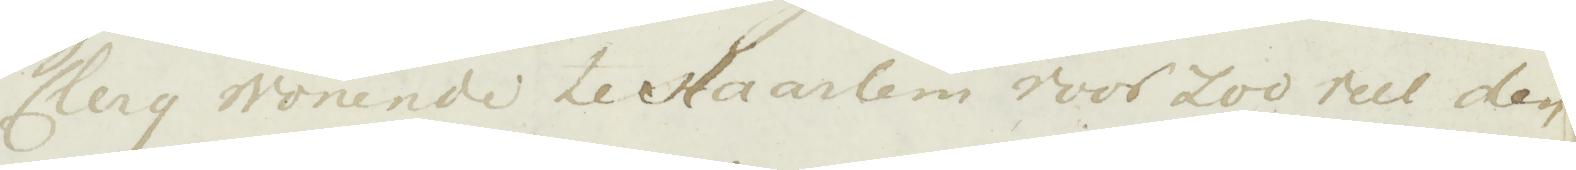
Clerq wonende te Haarlem voor zoo veel den
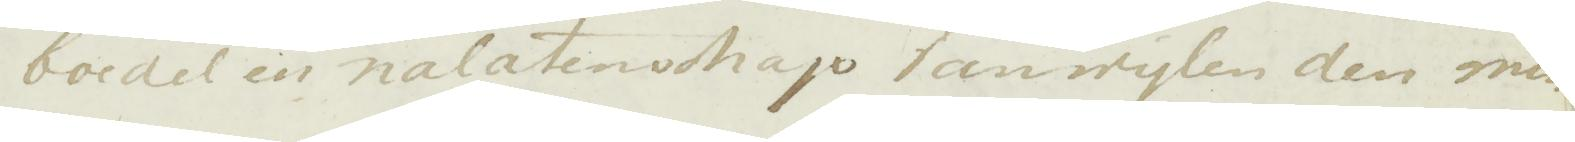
boedel in nalatenschap van wijlen den min
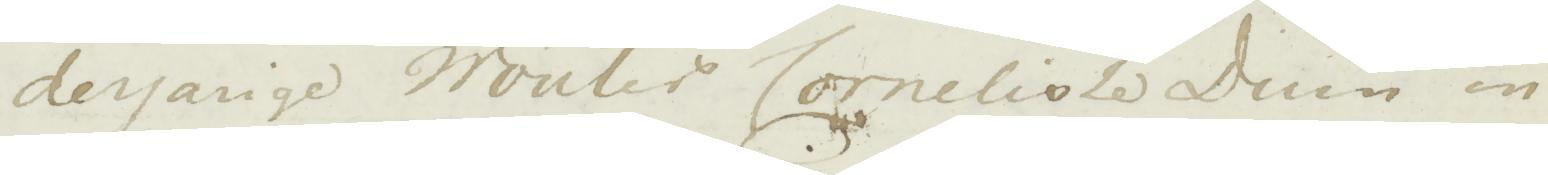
derjarige Wouter Cornelisz Duin in
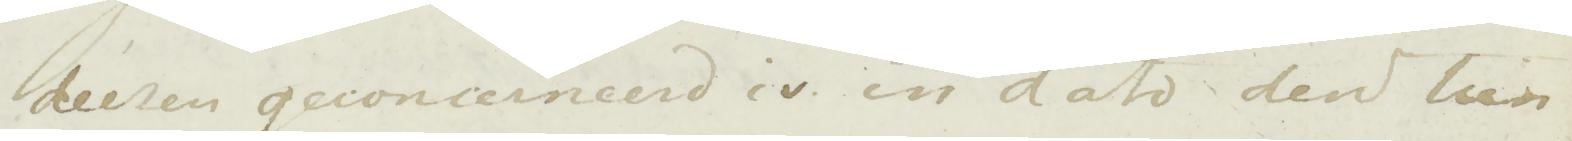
deezen geconcerneerd is. in dat den tien
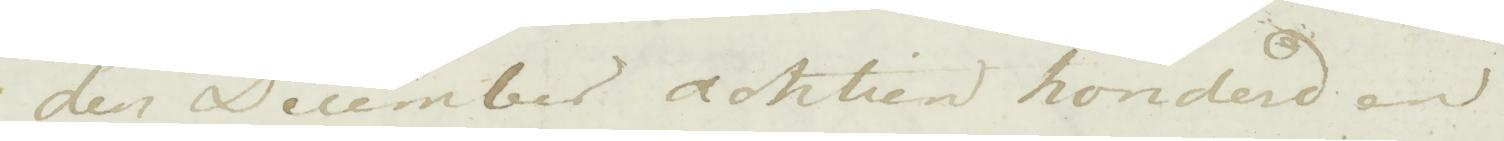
den December achtien honderd en
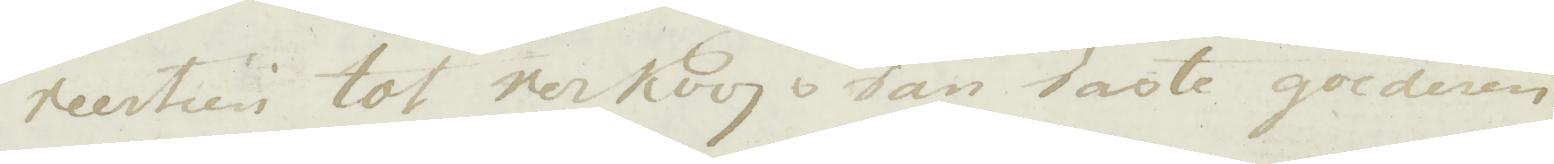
veertien tot verkoop van vaste goederen
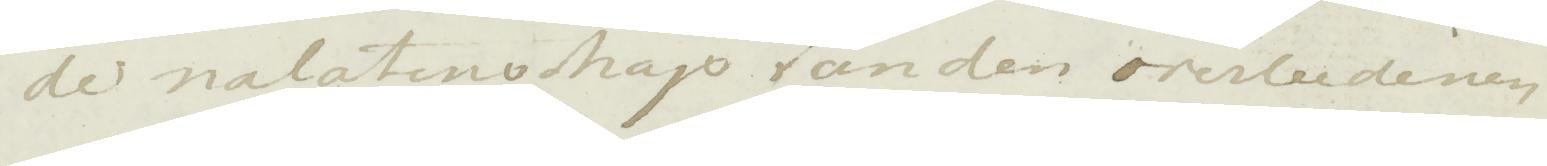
de nalatenschap van den overleedenen
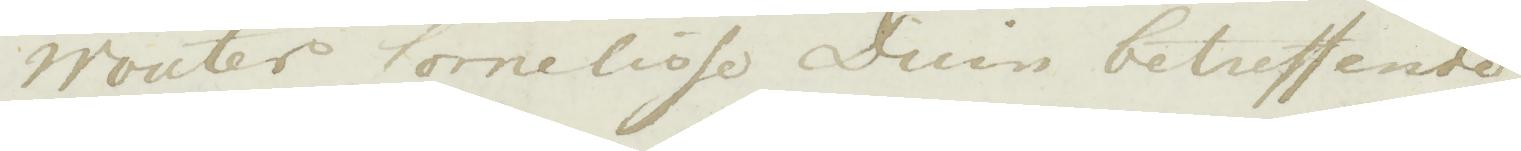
Wouter Cornelisse Duin betreffende
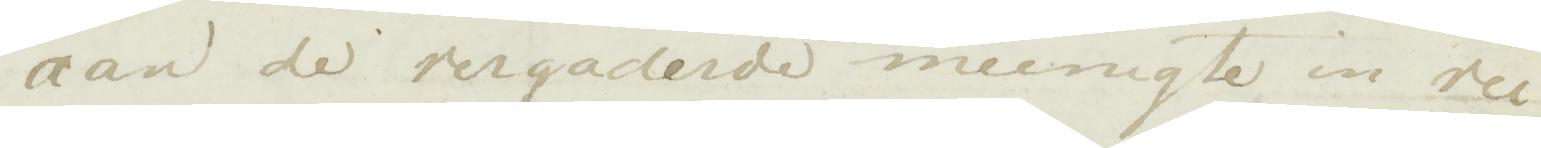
aan de vergaderde meenigte in vei
